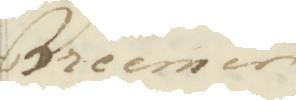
Breemer
